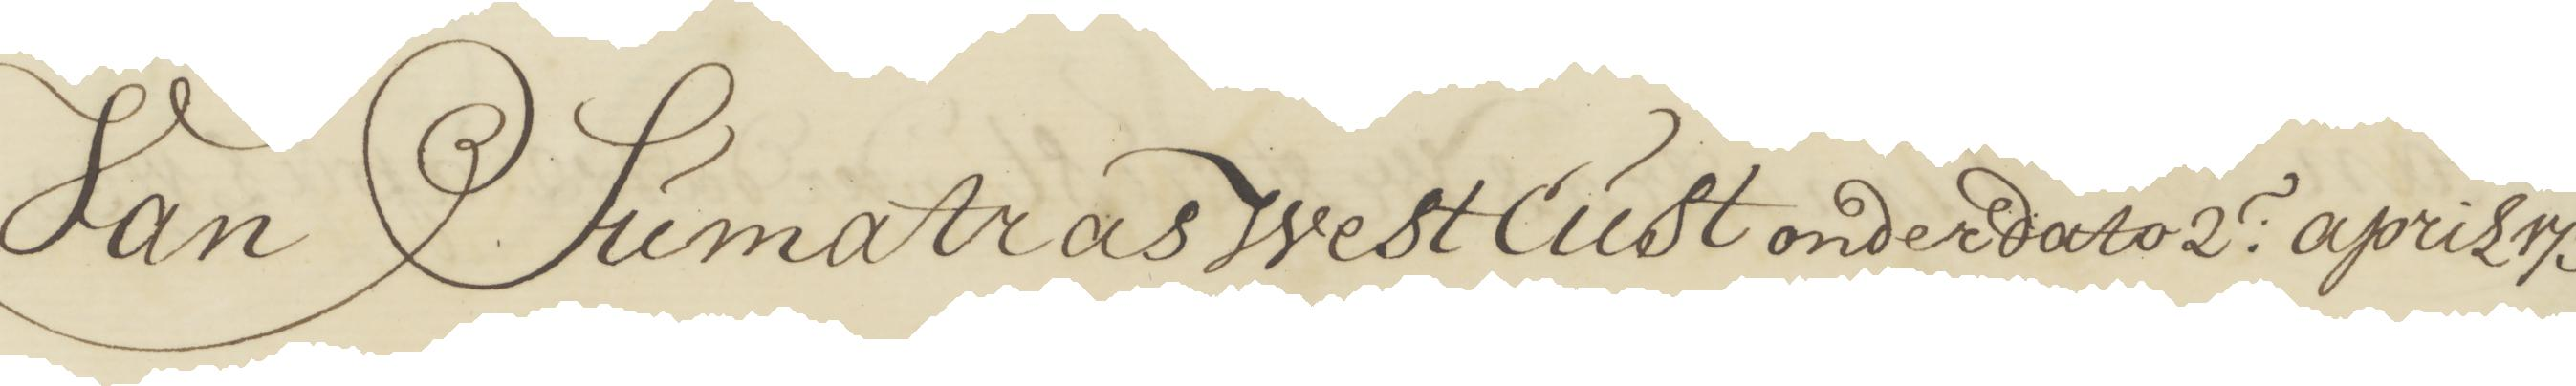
Van Sumatras West Cust onder dato 2:' april 1733.
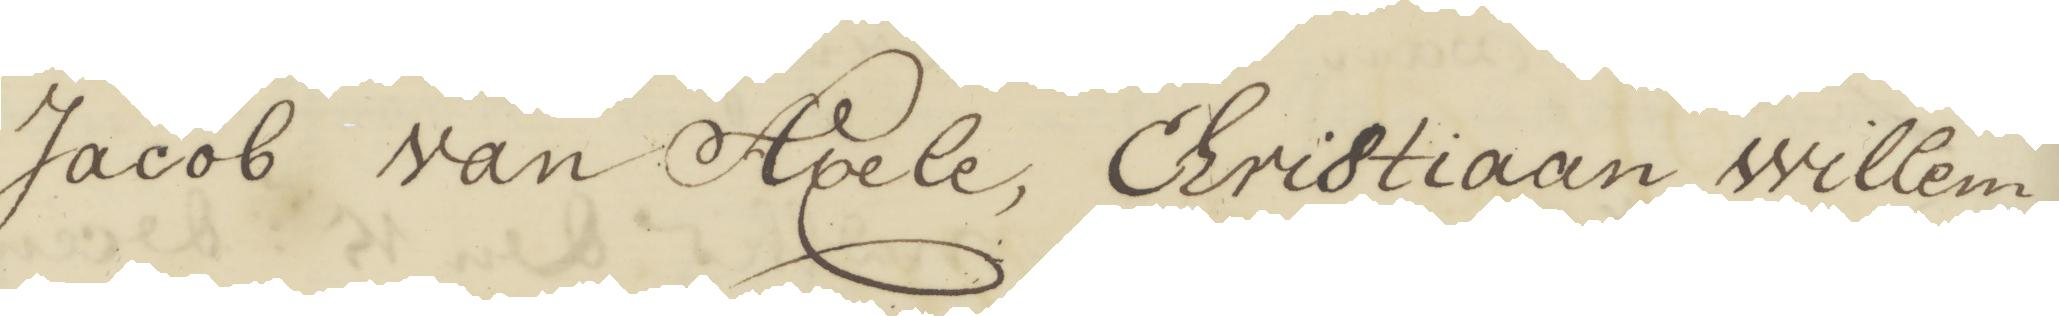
Jacob van Axele, Christiaan Willem
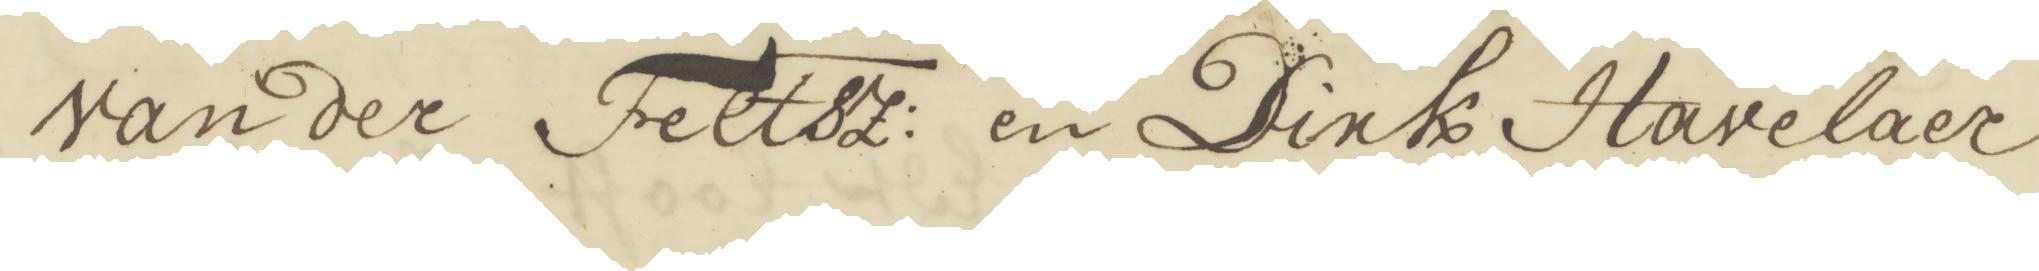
van der Feltsz: en Dirk Havelaer
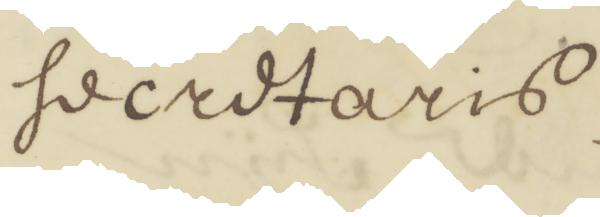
Secretaris;
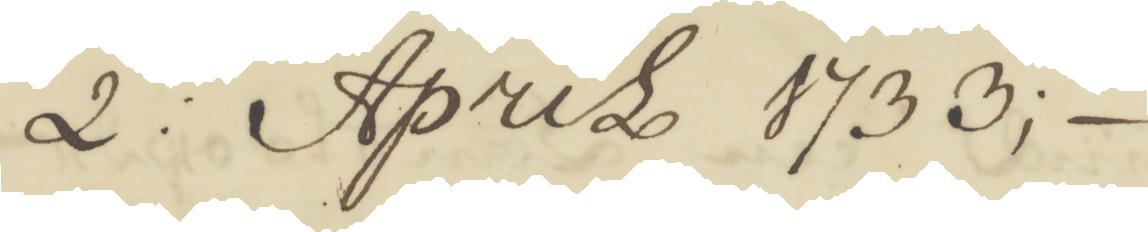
2:' April 1733;
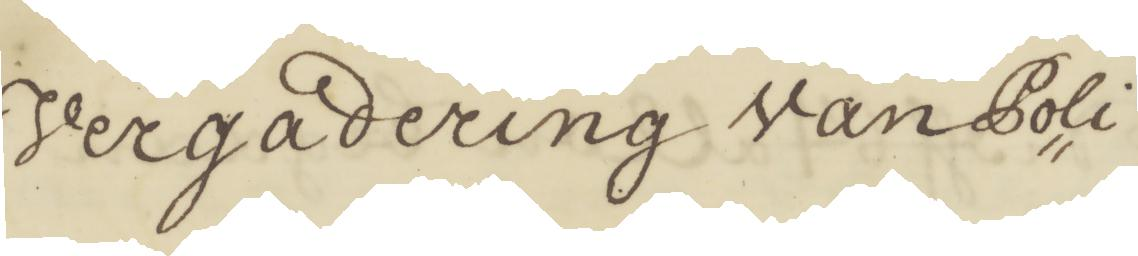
vergadering van Poli„
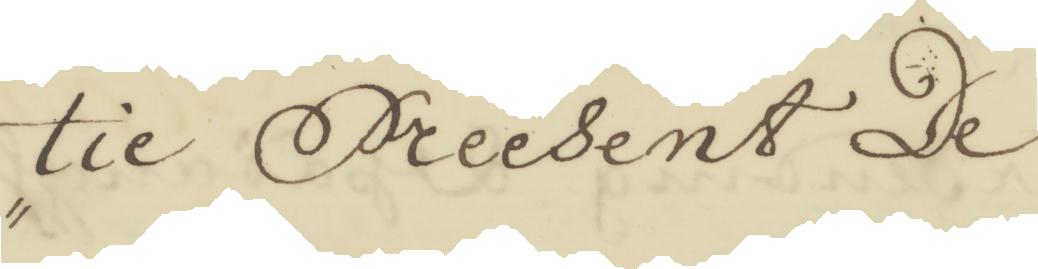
„tie preesent De
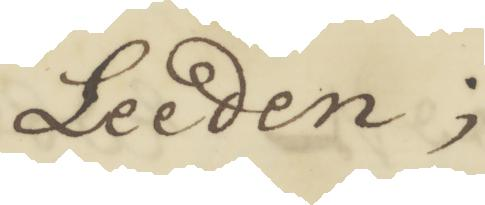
Leeden;
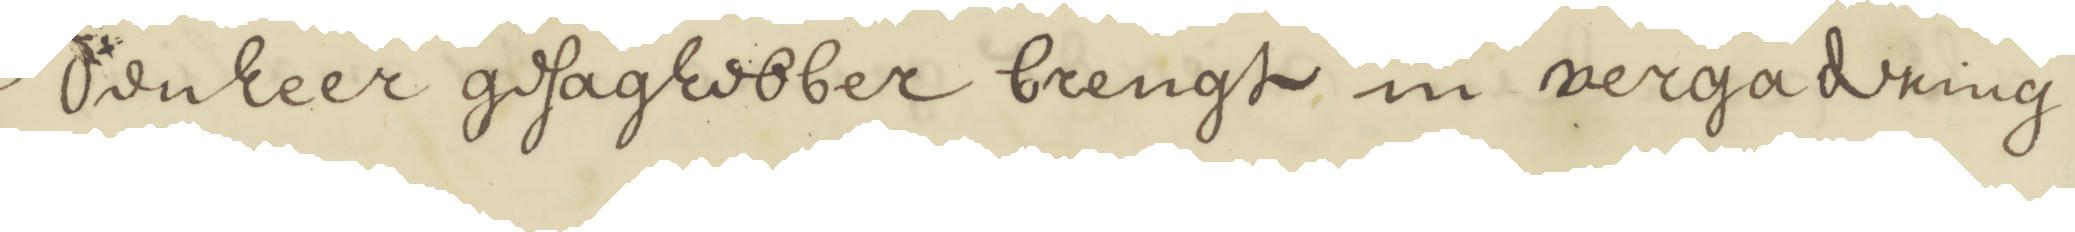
den heer gesaghebber brengt in vergadering
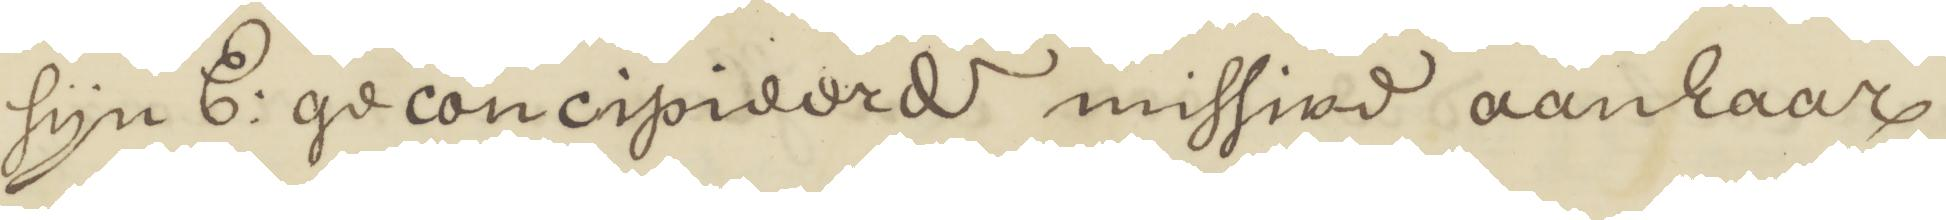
sijn E: geconcipieerde missive aanhaar
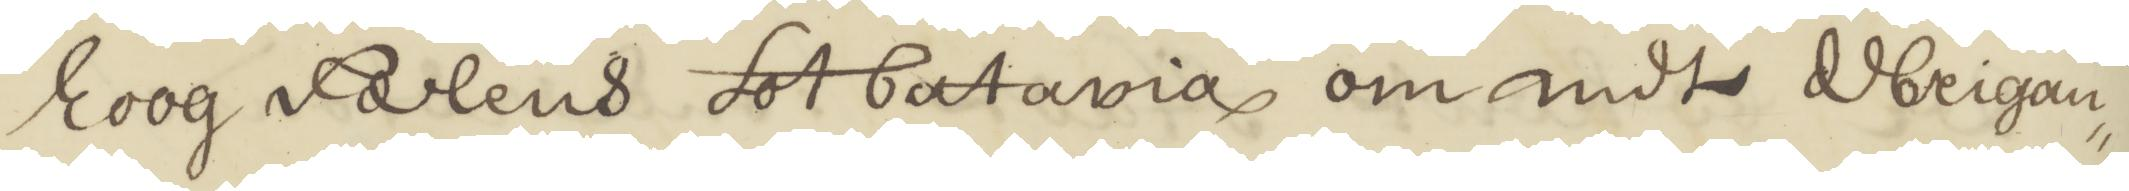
hoog Edelens tot batavia om met de brigan„
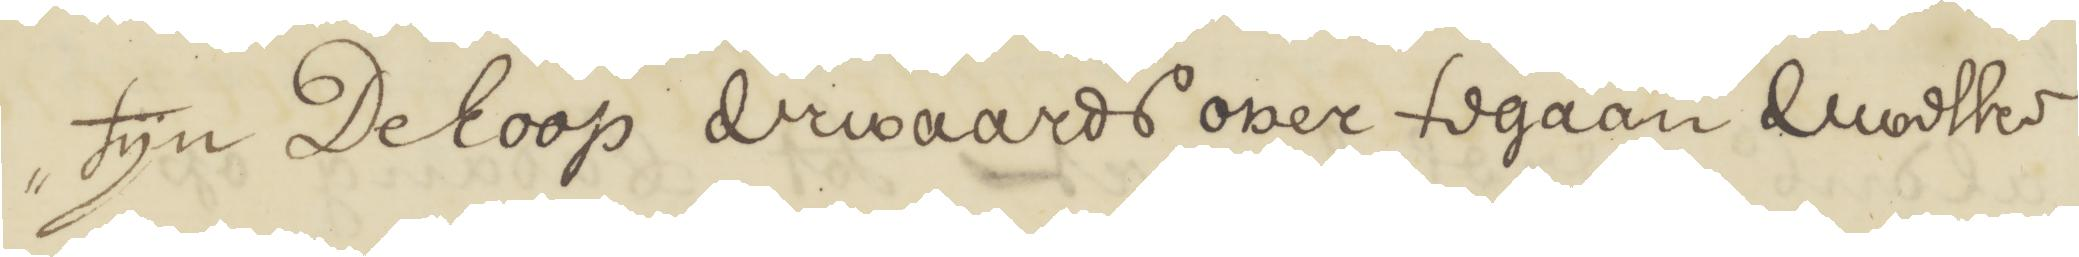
„tijn De hoop derwaards over te gaan dewelke
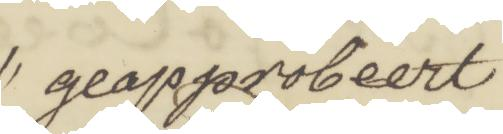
"geapprobeert
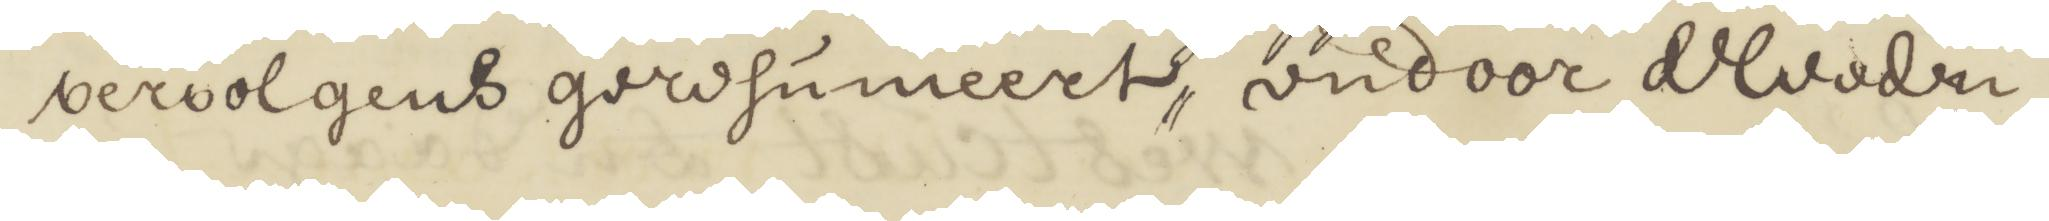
vervolgens geresumeert „ en door de leeden
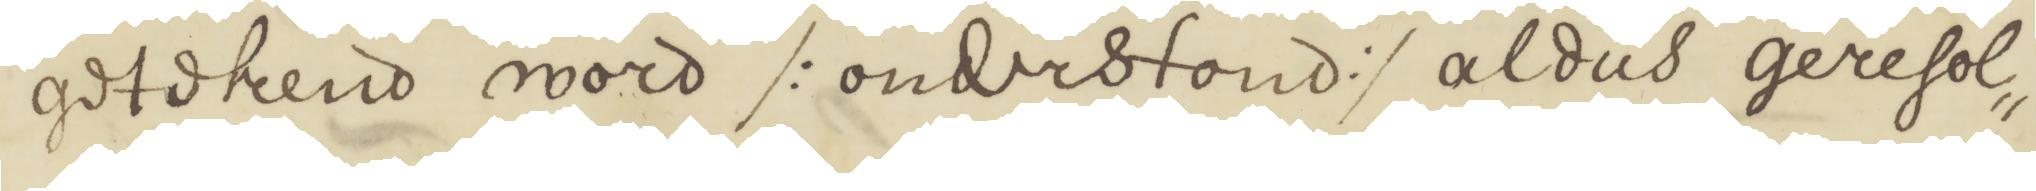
getekend word /: onderstond:/ aldus geresol„
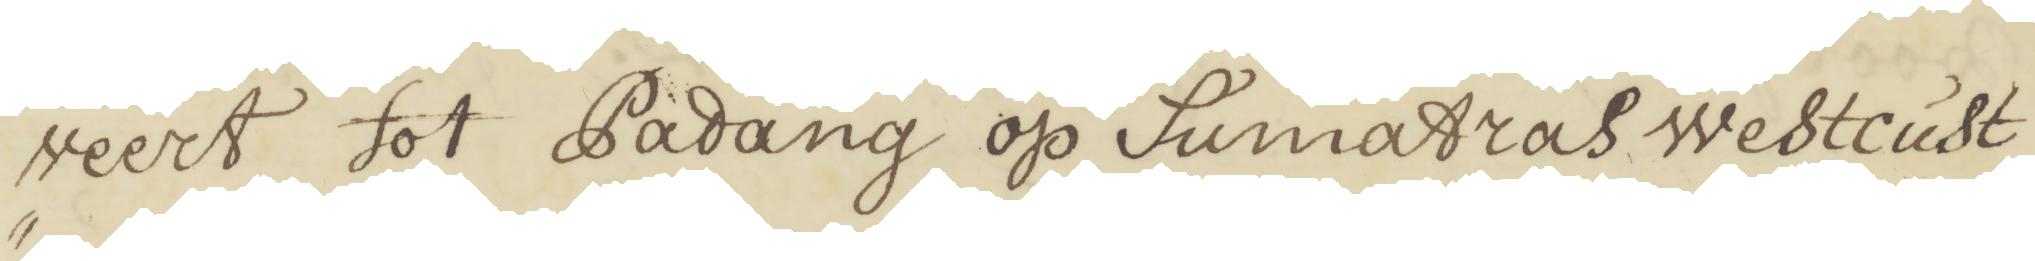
„veert tot Padang op Sumadras westcust
